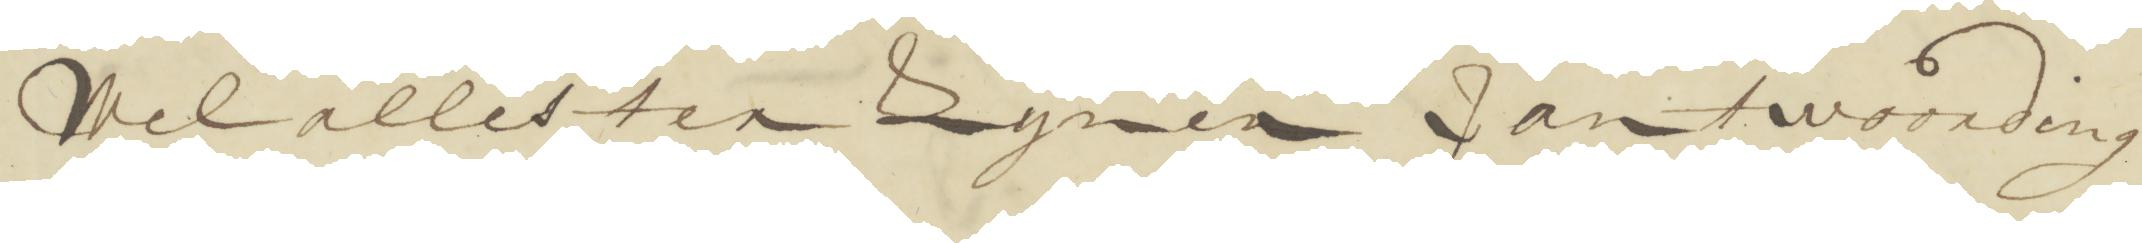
Wel alles ter zijner verantwoording
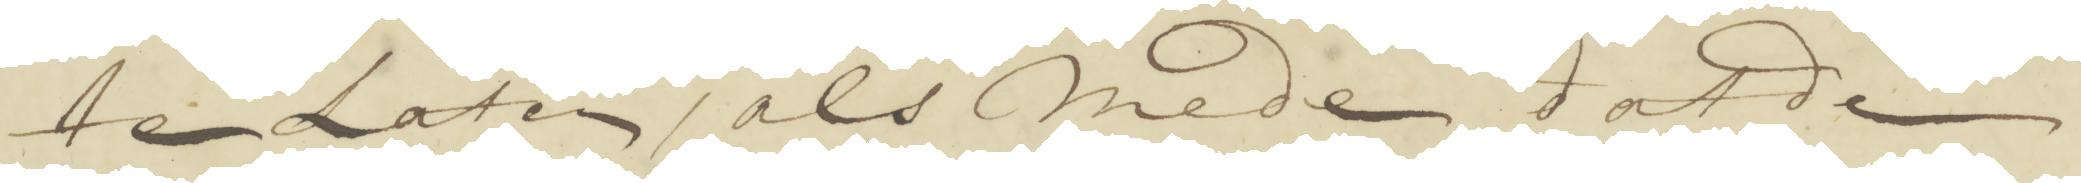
te Laten, als Mede dat de
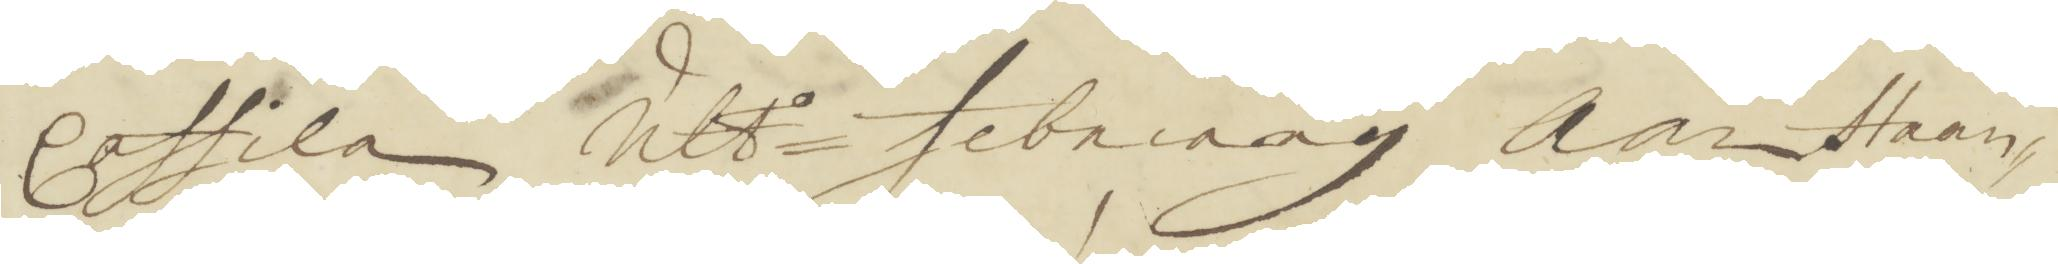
Caffila ult=o Februarij Aanstaan„
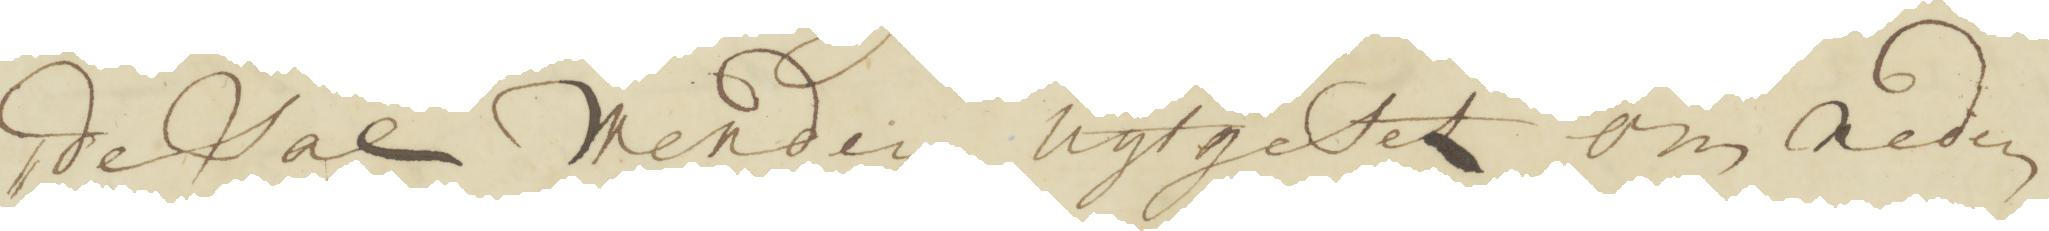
„de sal Werden uijtgeset om reden
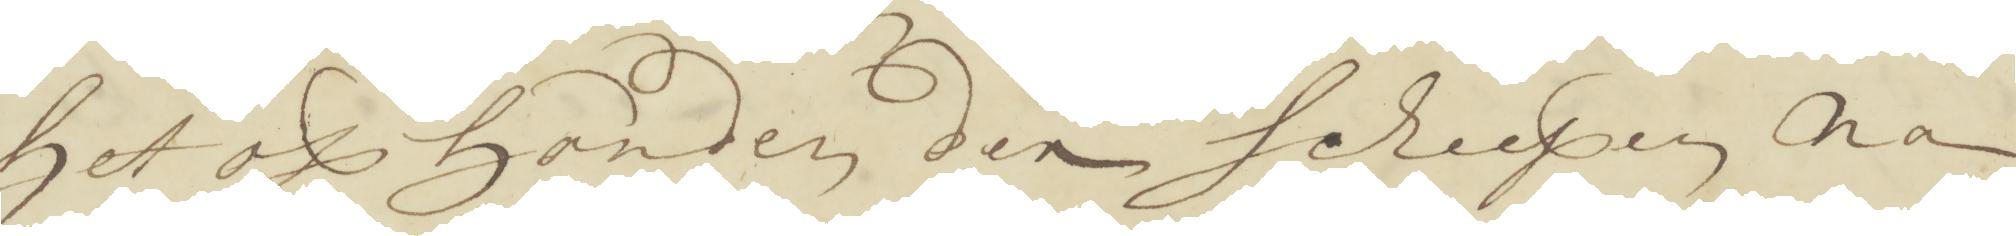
het op houden der Scheepen na
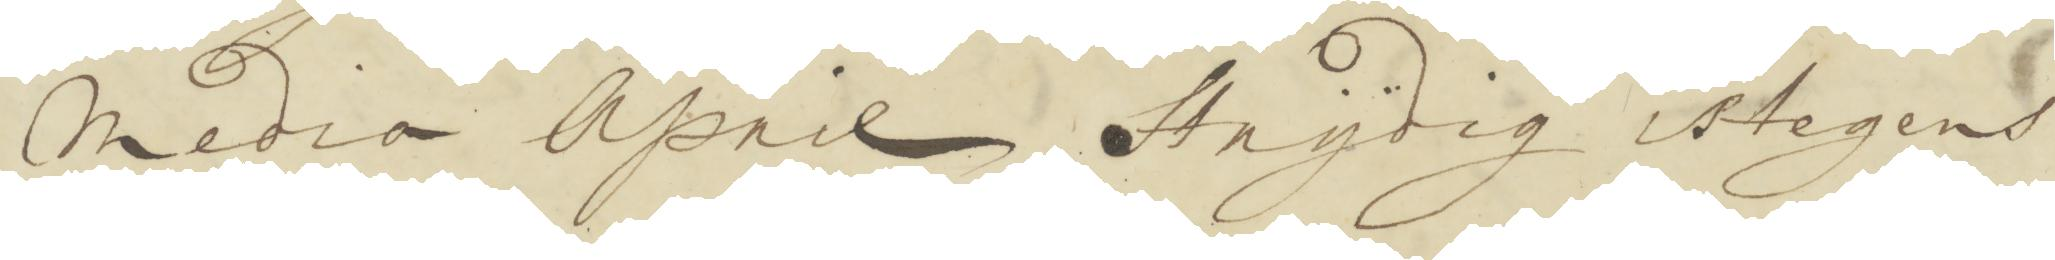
Medio April strijdig is tegens
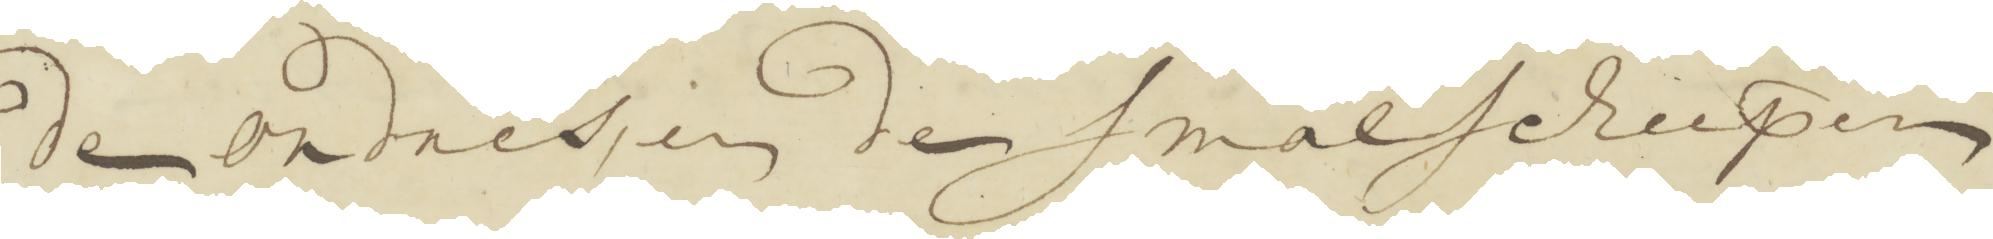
de ordres, in de Smalscheepen
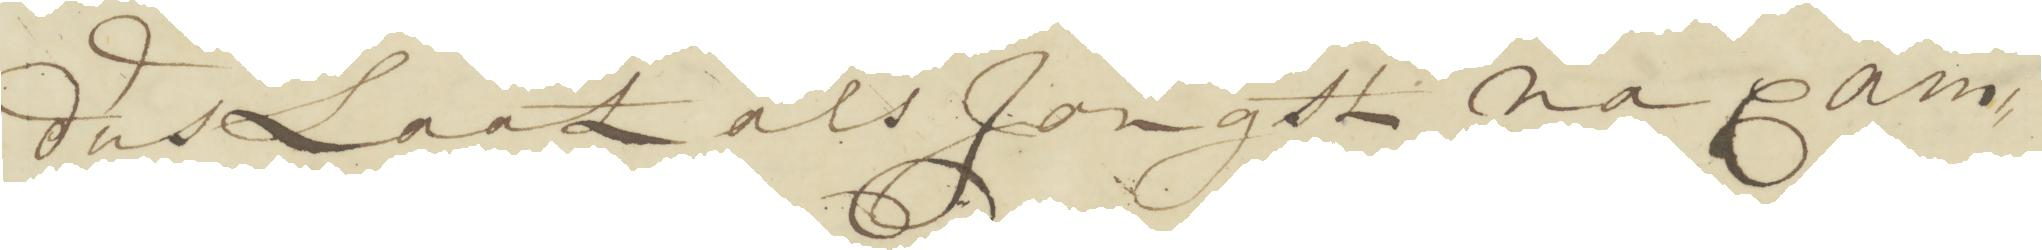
dus Laat als Jongst na Cam„
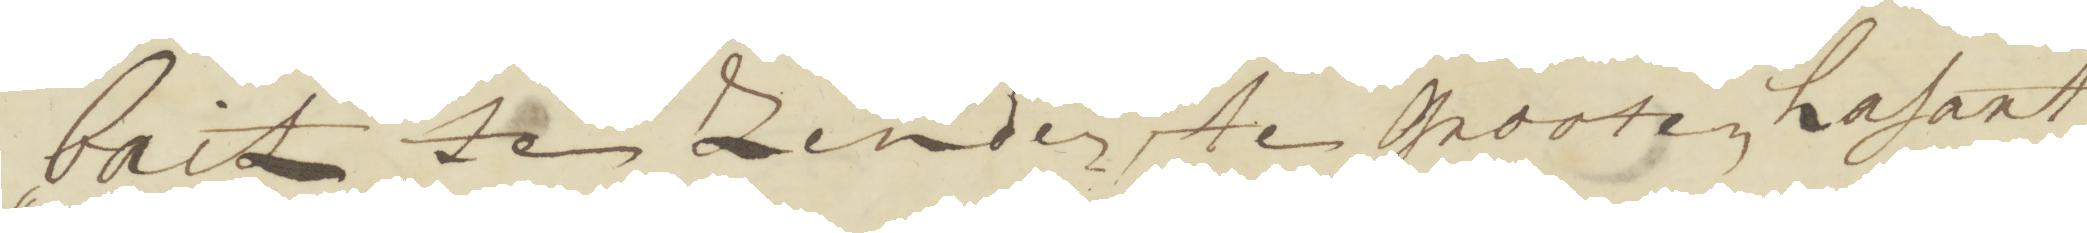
bait te zenden, te Grooten hasart
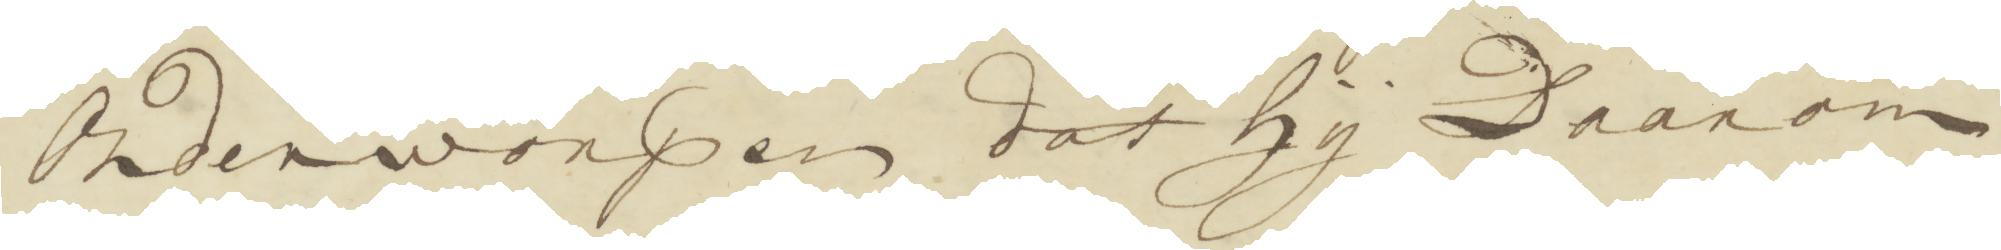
Onderworpen dat hij Daarom
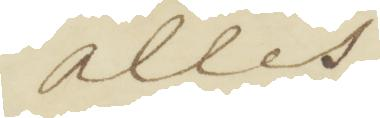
alles
